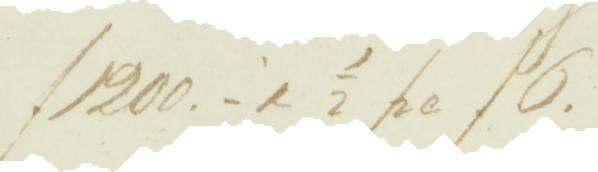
ƒ1200.-'t ½ pc ƒ6.
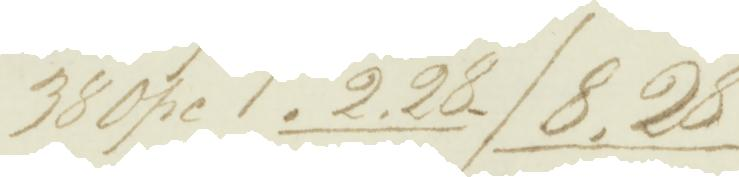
38 Opc . 2.28 ƒ 8,28
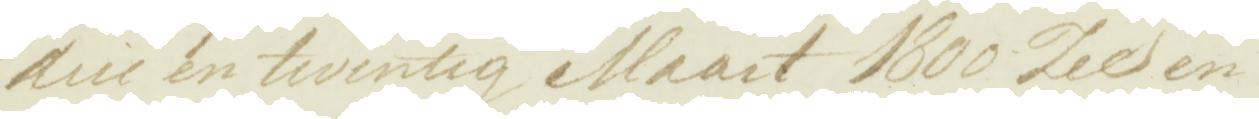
drie en twintig Maart 1800 Zes en
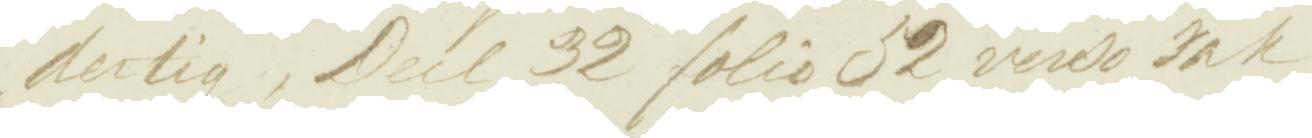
dertig, Deel 32 folio 52 verso vak
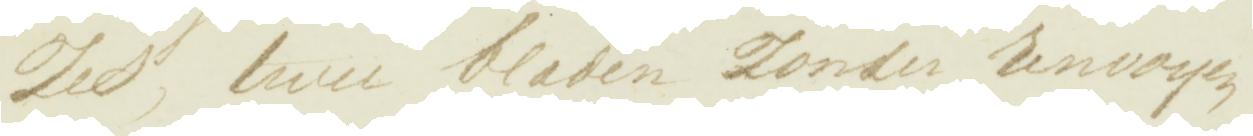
Zes, twee bladen zonder renvoyen
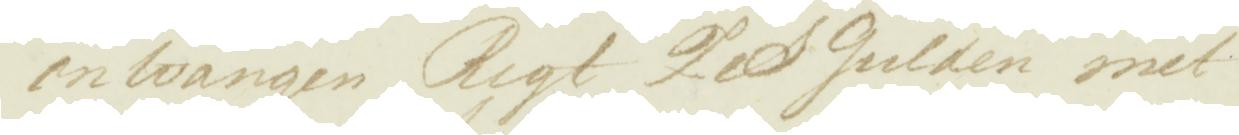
ontvangen Regt Zes Gulden met
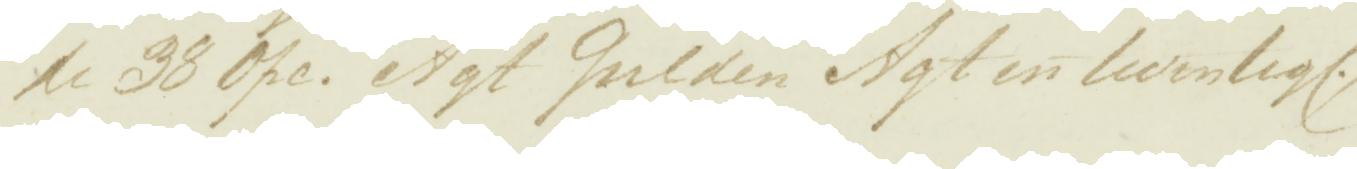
de 38 Opc. Agt Gulden Agt en twintigC.
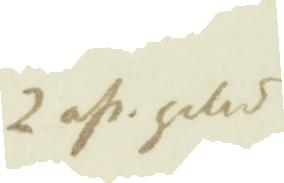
2 afs. gelev
